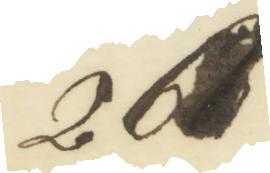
261
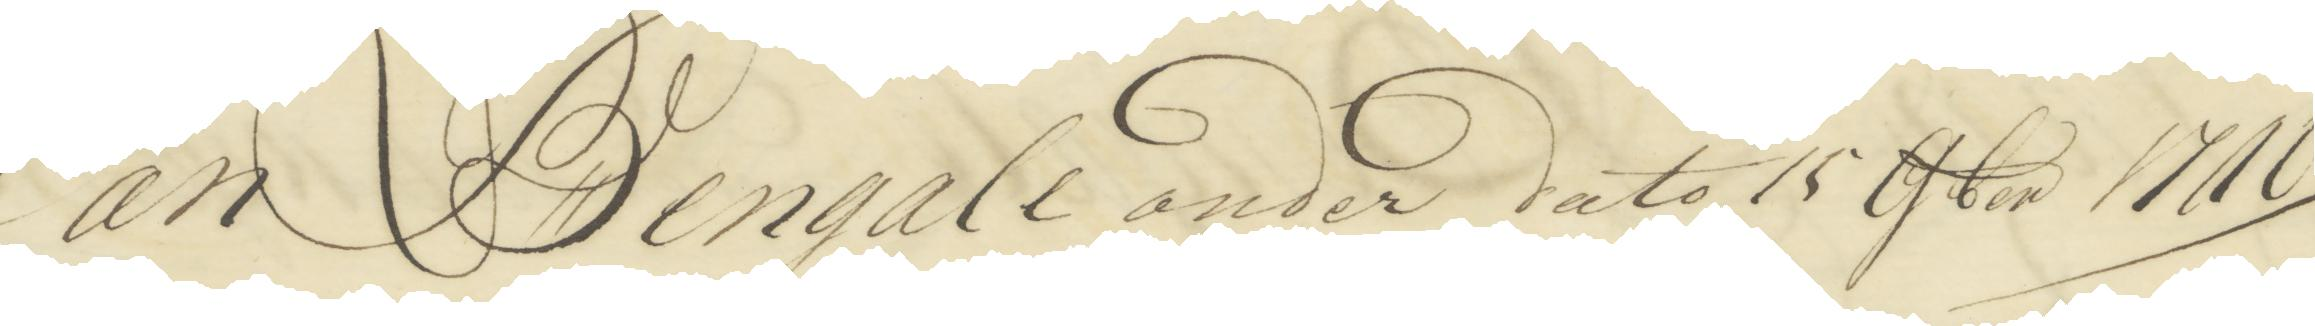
Van Bengale onder dato 15 9ber 1746
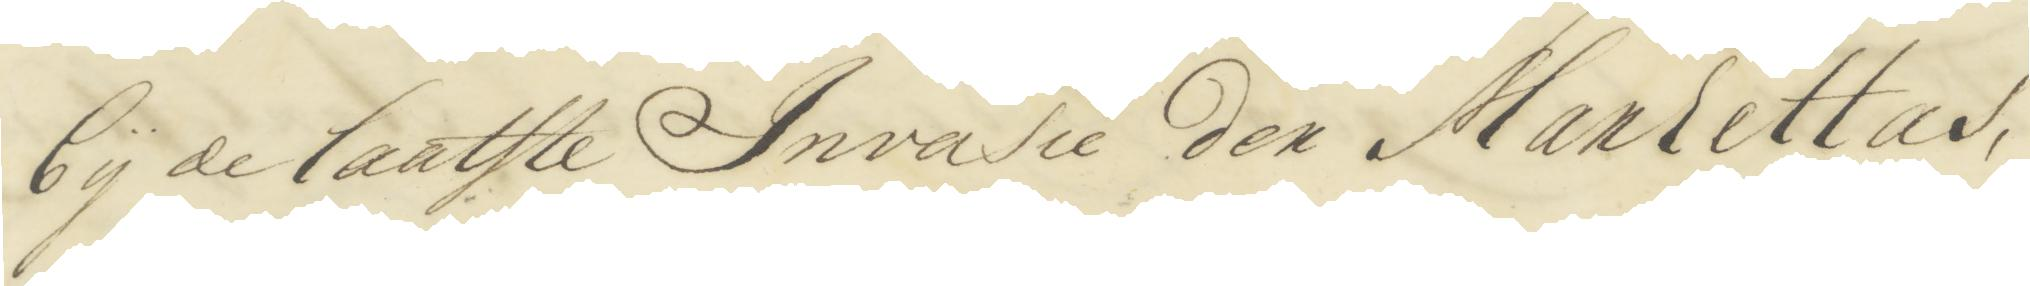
bij de laatste Invasie der Marhettas,
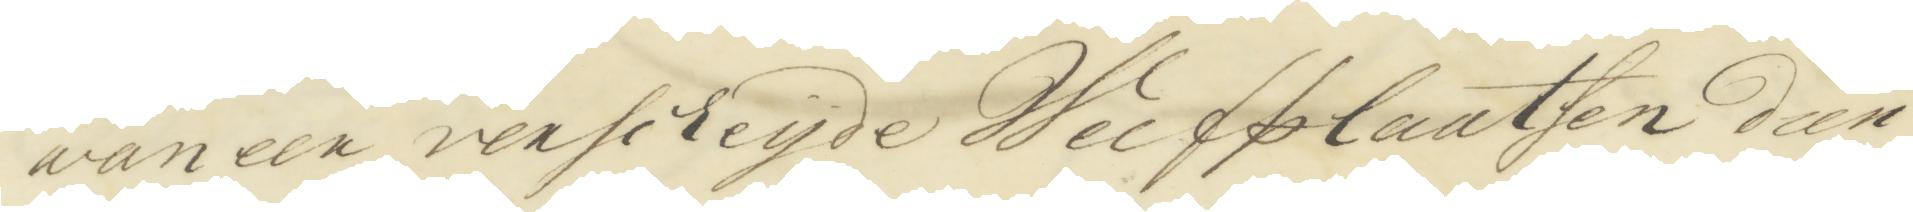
van eer verscheijde Weefplaatsen dien
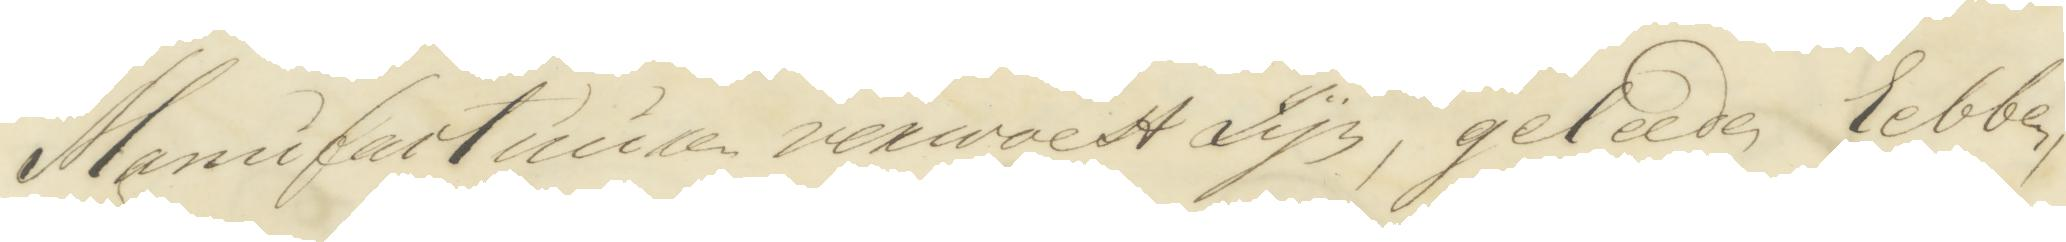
Manufactuuren verwoest zijn, geleeden hebben,
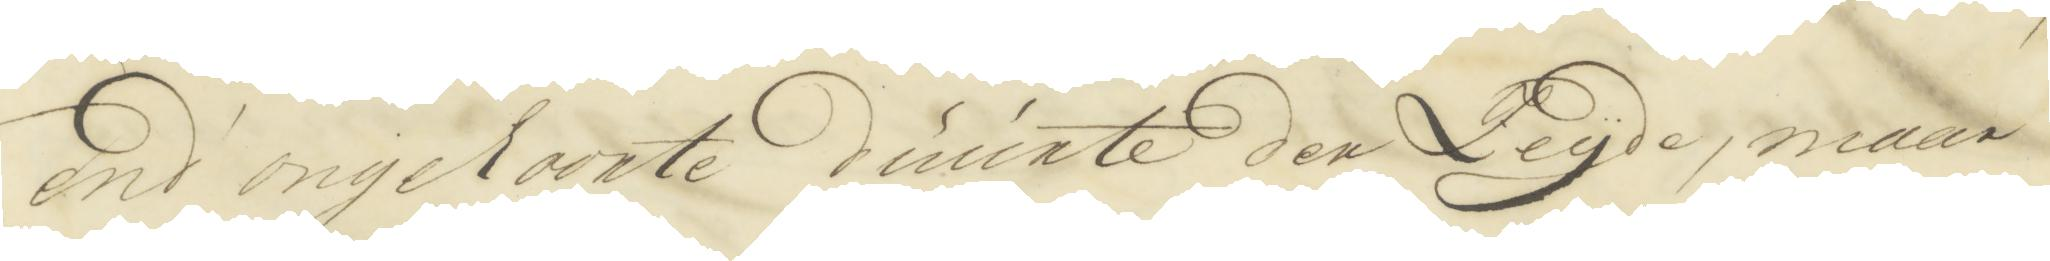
end' ongehoorte duurte der zeijde, maar
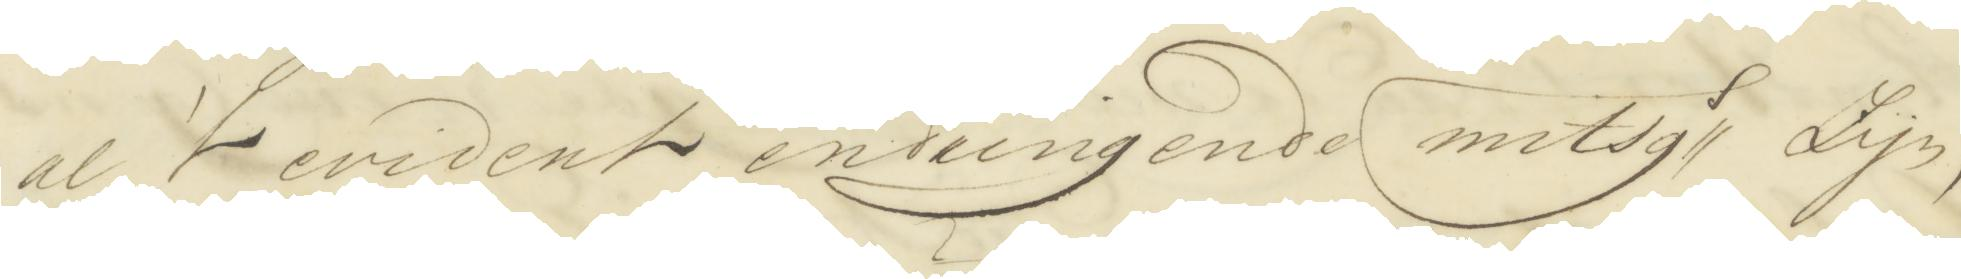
al 't evident en dringende mitsg„s zijn
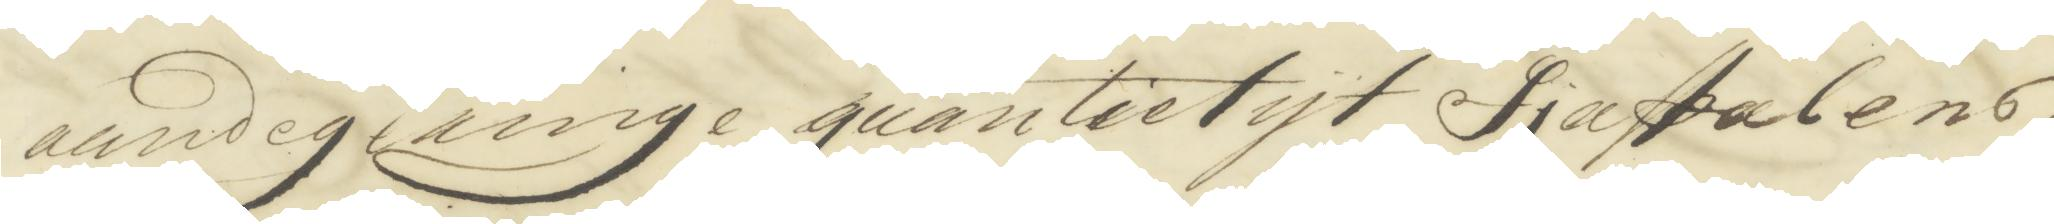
aan de geringe quantietijt sjapalens,
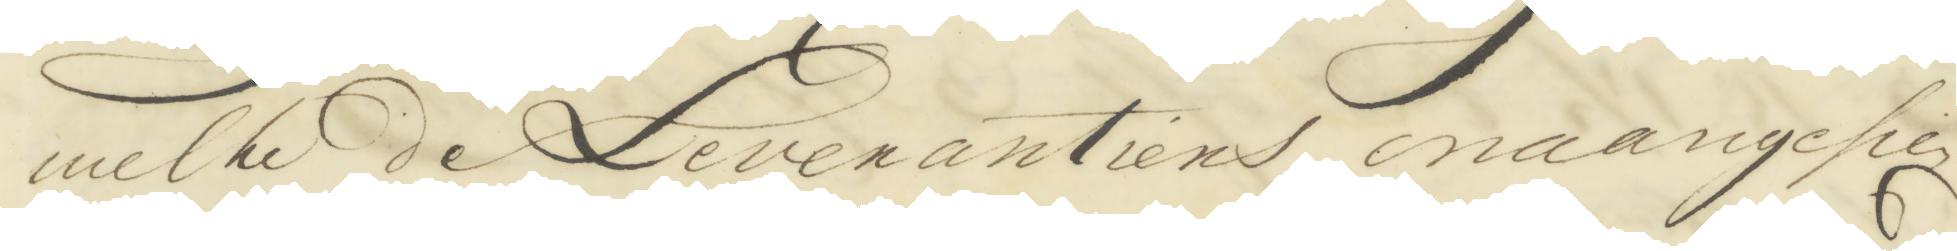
welke de Leverantiers onaangesien
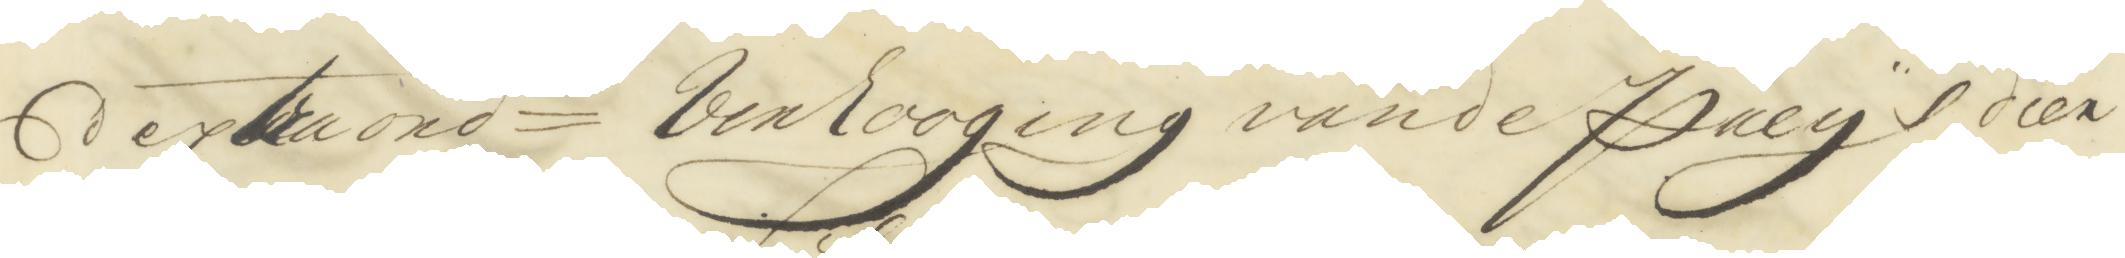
d' extra ord=re verhooging van de preijs dier
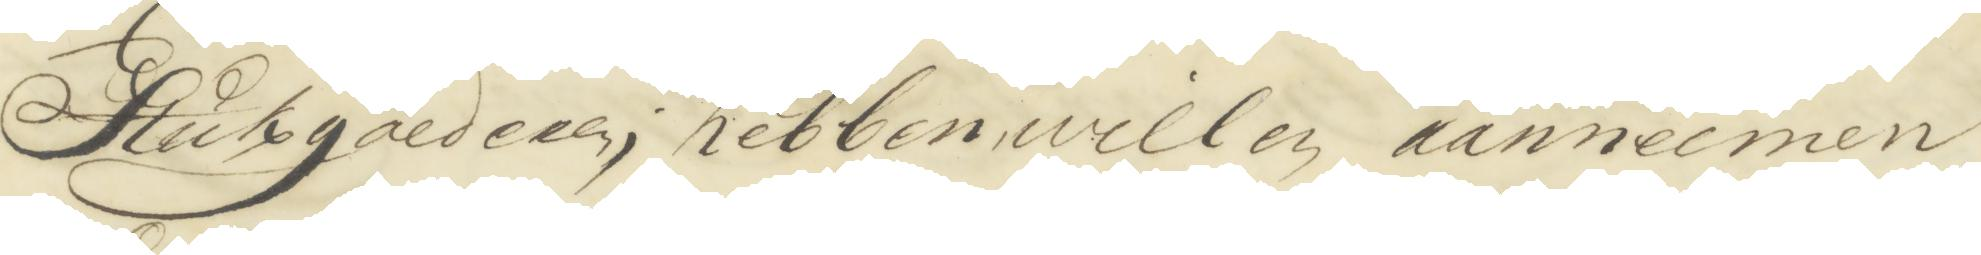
stuk goederen; hebben willen aanneemen
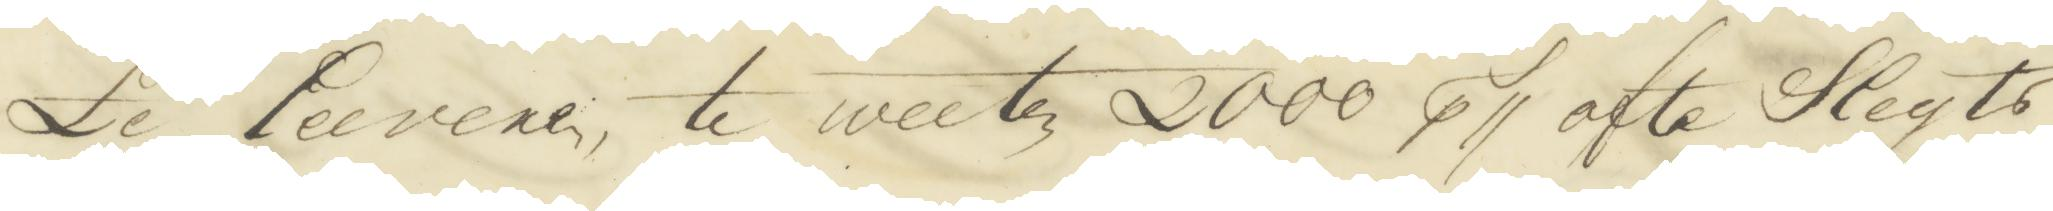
te leeveren, te weeten 2000 p„s ofte slegts
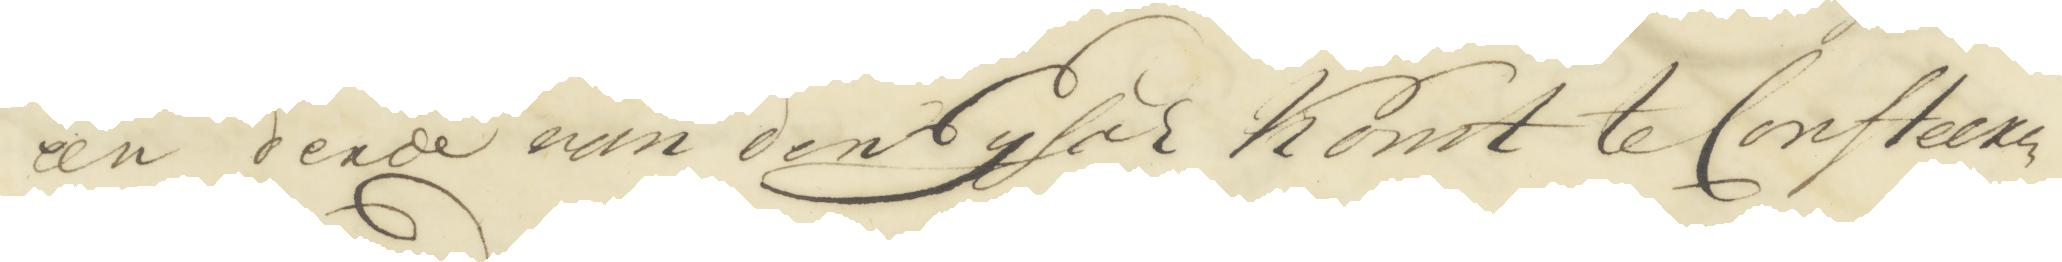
een derde van den Eijsch komt te Consteeren
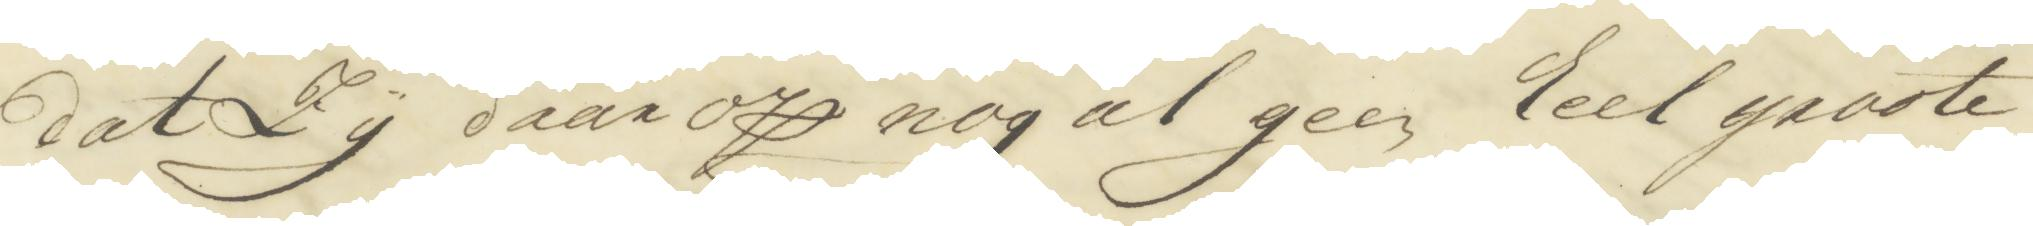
dat zij daar op nog al geen heel groote
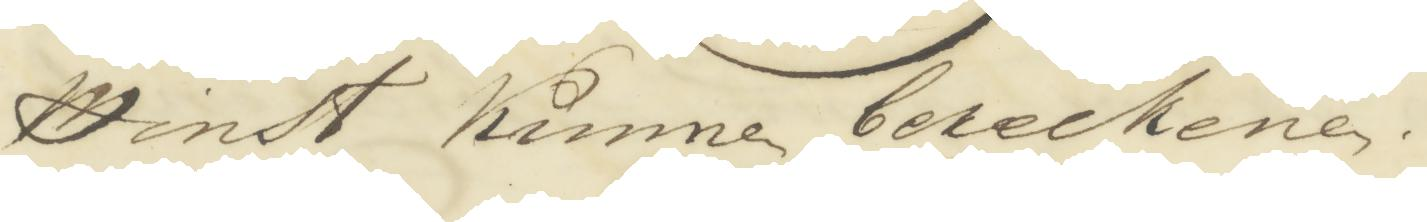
Winst kunnen bereckenen.
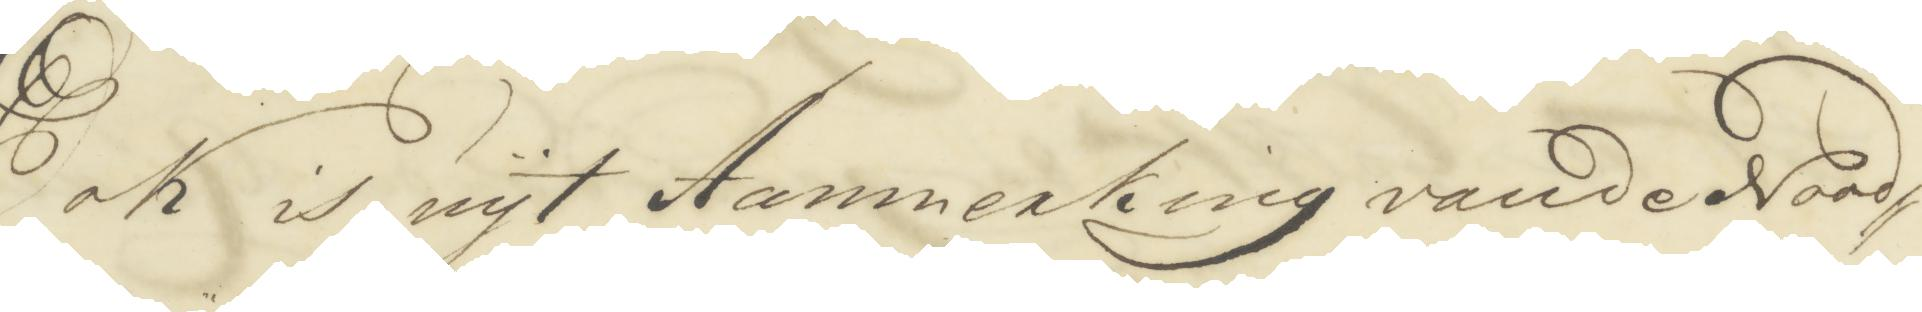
Ook is, uijt Aanmerking van de Nood„
